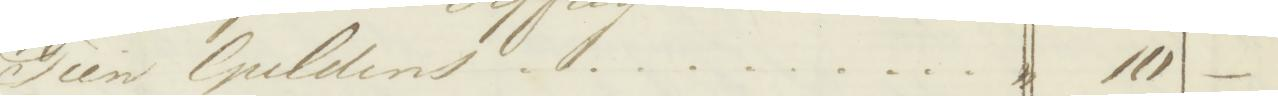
Tien Guldens . . . . . . . . . . „ 10 —
